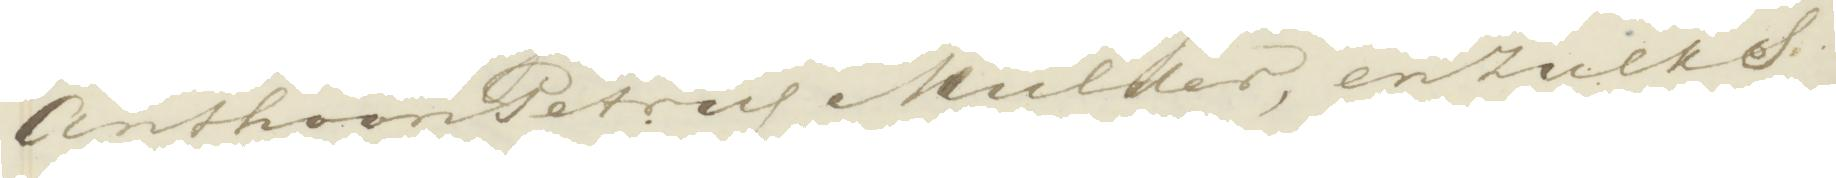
Anthoon Petrus Mulder, en zulks
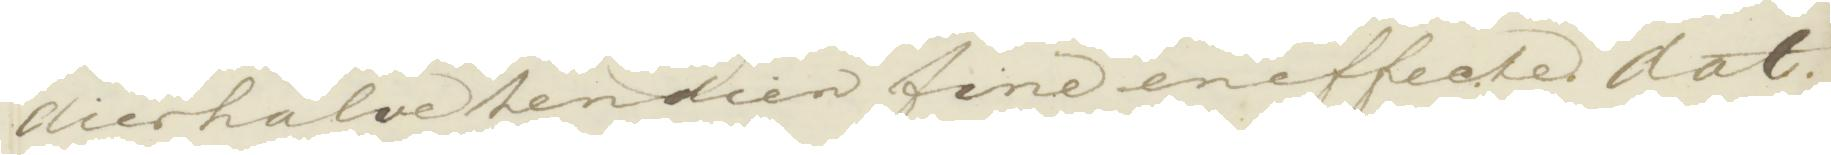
dier halve ten dien fine en effecte dat
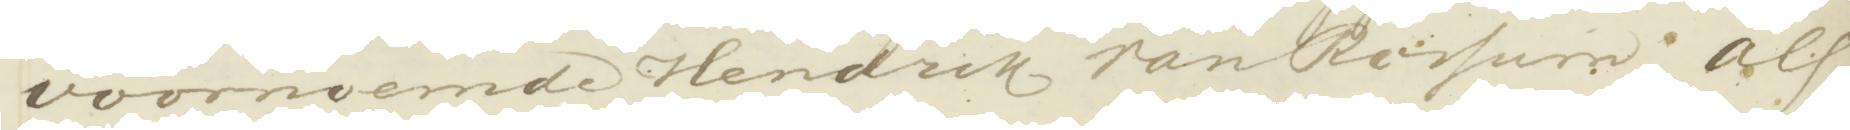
voornoemde Hendrik van Rossum als
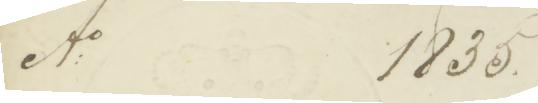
A:o 1835.
